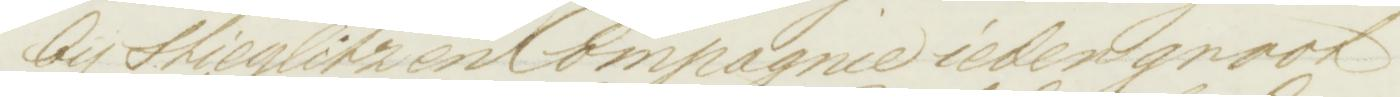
bij stieglitz en Compagnie ieder groot
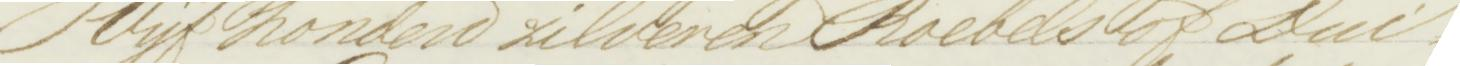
Vijf honderd zilveren Roebels of Dui„
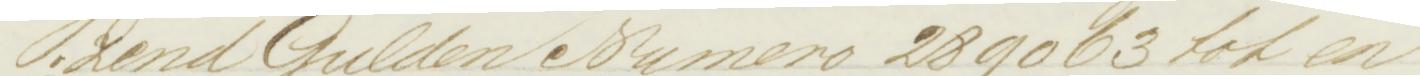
zend Gulden Numero 289063 tot en
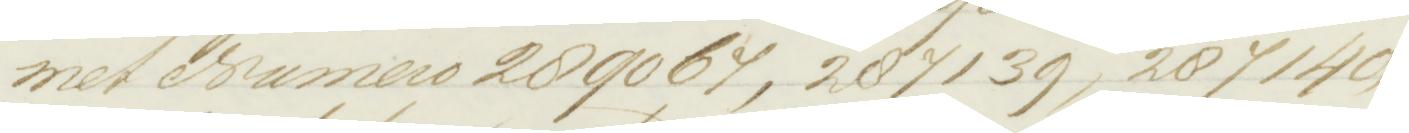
met Numero 289067, 287139, 287140,
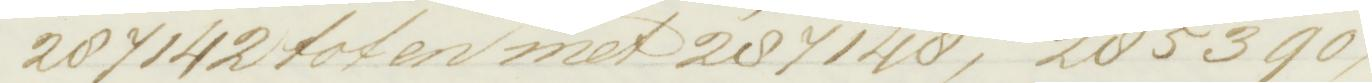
287142 tot en met 287148, 285390,
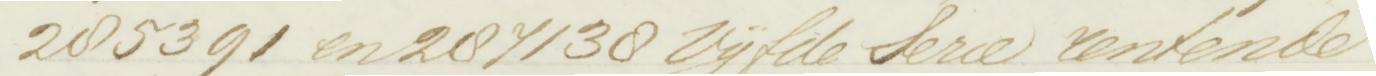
285391 en 287138 vijfde Serie rentende
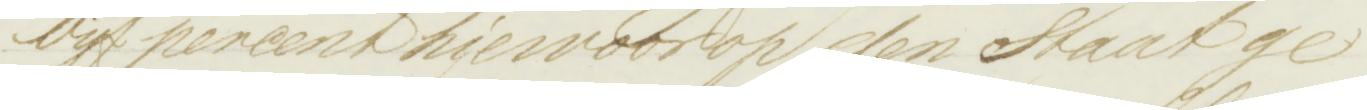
vijf percent hiervoor op den staat ge
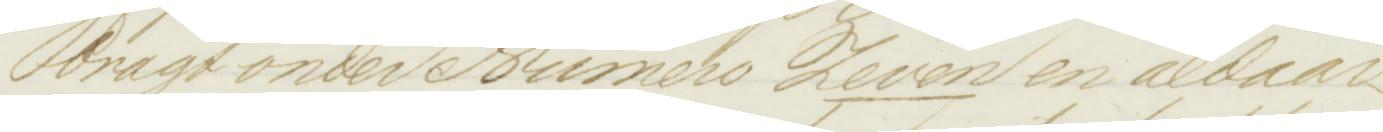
bragt onder Numero Zeven en aldaar
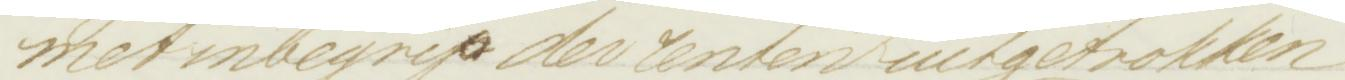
met inbegrip der renten uitgetrokken
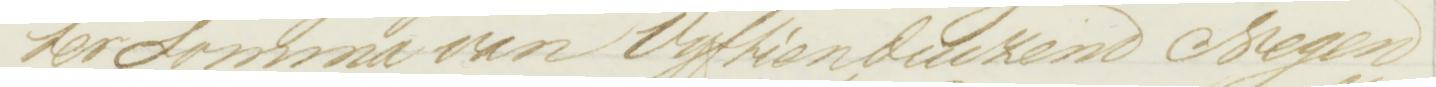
ter somma van Vyftienduizend Negen
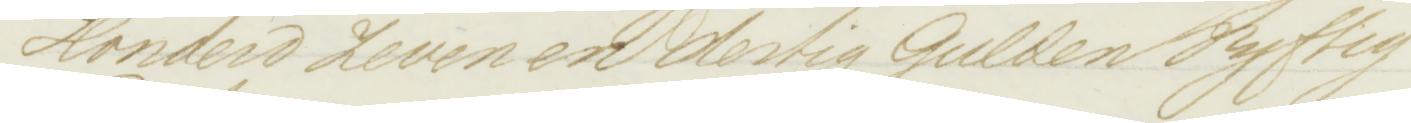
Honderd Zeven en dertig Gulden Vyftig
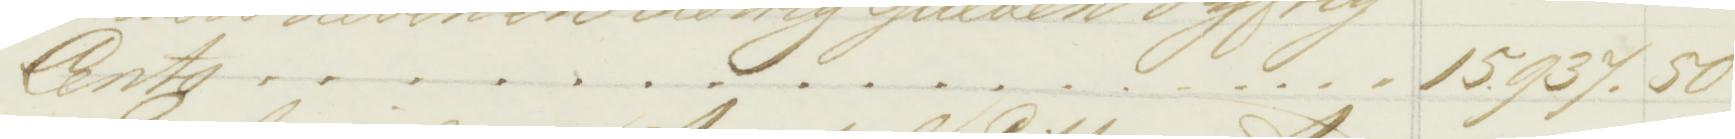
Cents . . . . . . . . . . . . . . . . . „15.937. 50
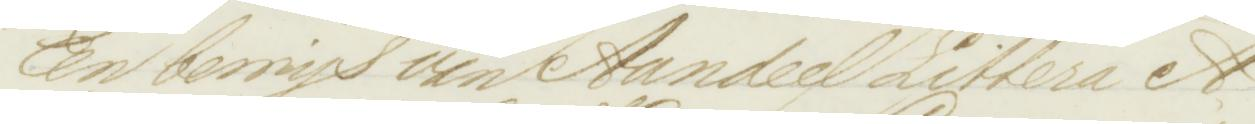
Een bewijs van Aandeel Littera A
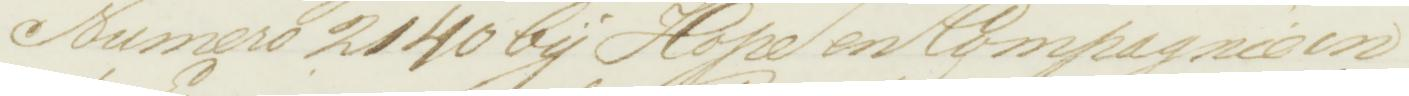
Numero 2140 bij Hope en Compagnie in
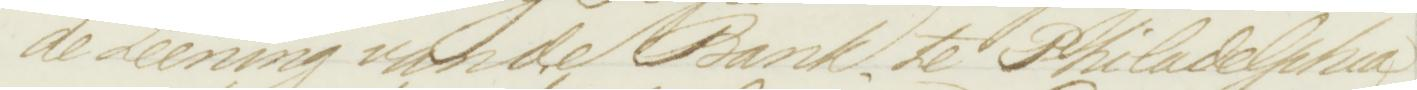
de Leening van de Bank te Philadelphia
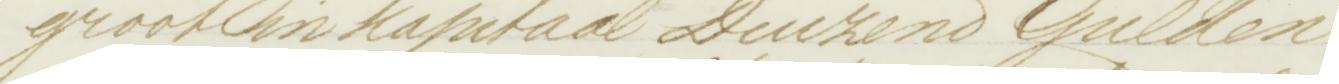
groot in kapitaal Duizend Gulden
